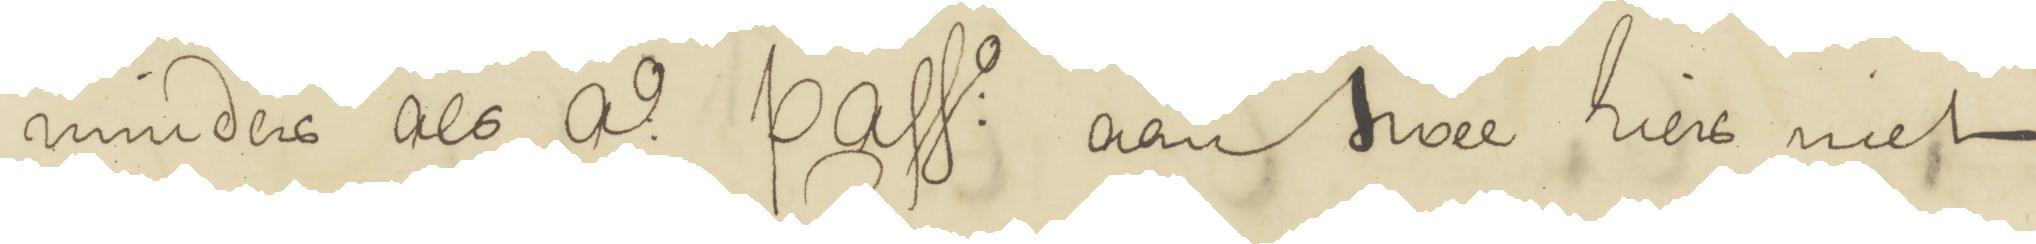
minder als a:o pass:o aan twee hier niet
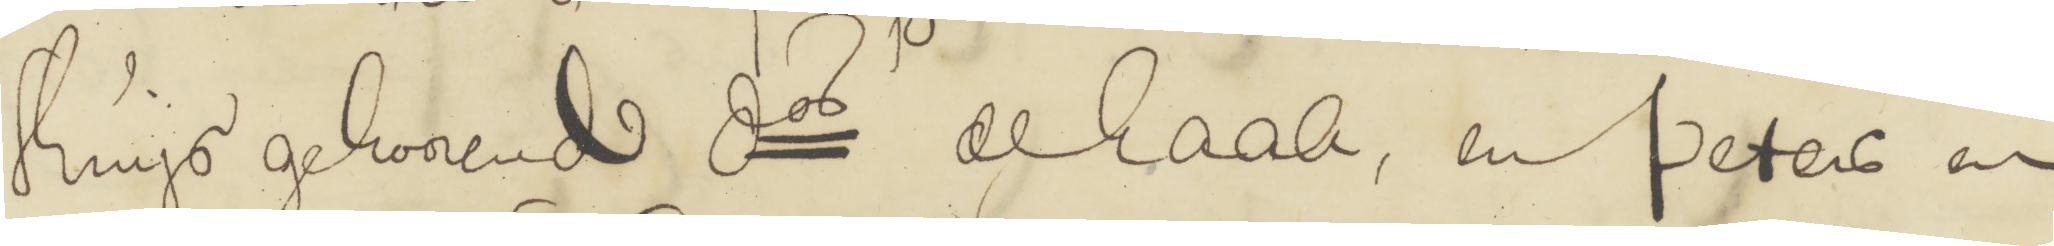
thuijs gehoorende d=os de haak, en Peter en
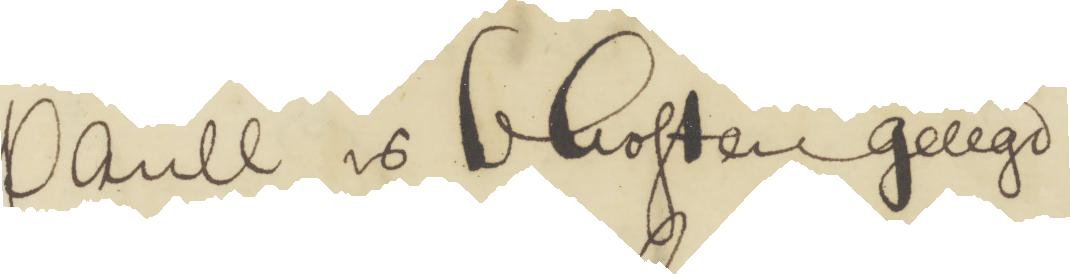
Paull is te kosten gelegd
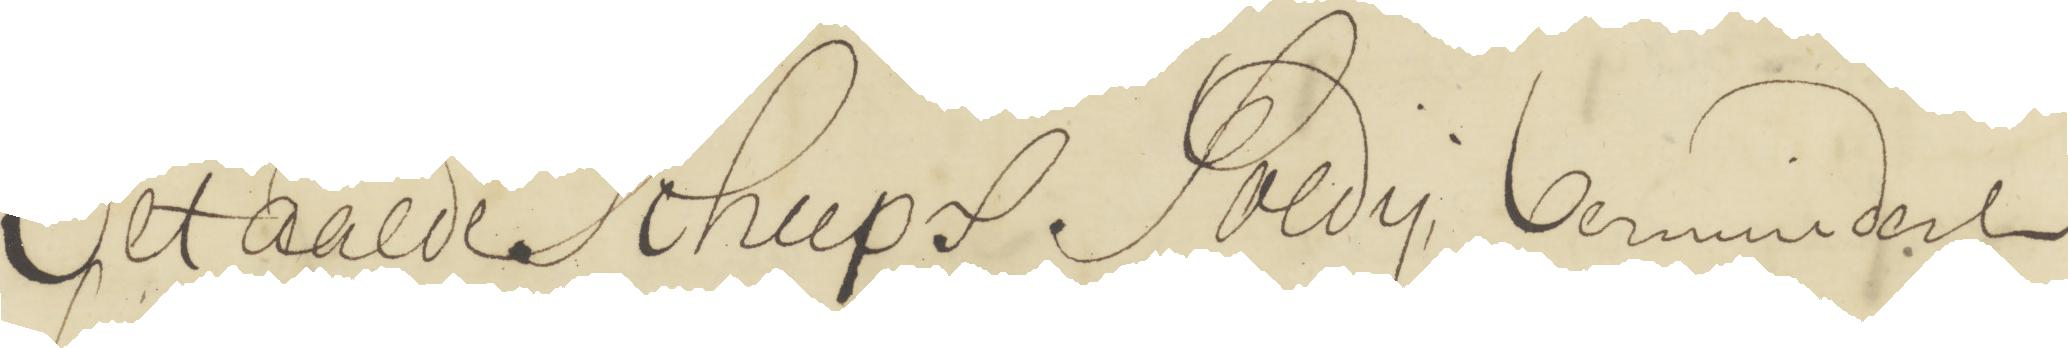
Betaalde scheeps Soldij, vermindert
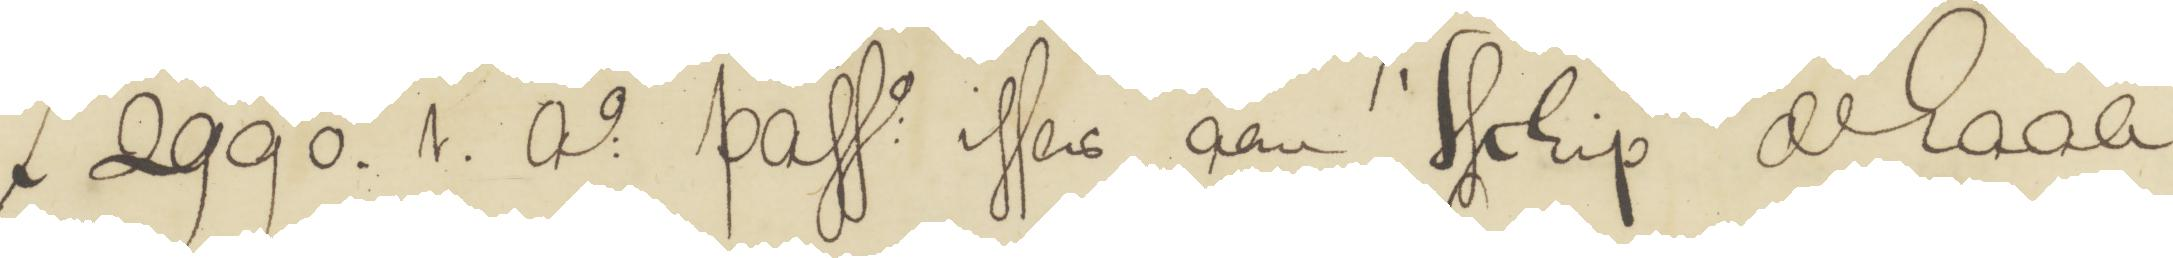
ƒ 2990. 1. a:o pass:o isser aan 'tschip de haak
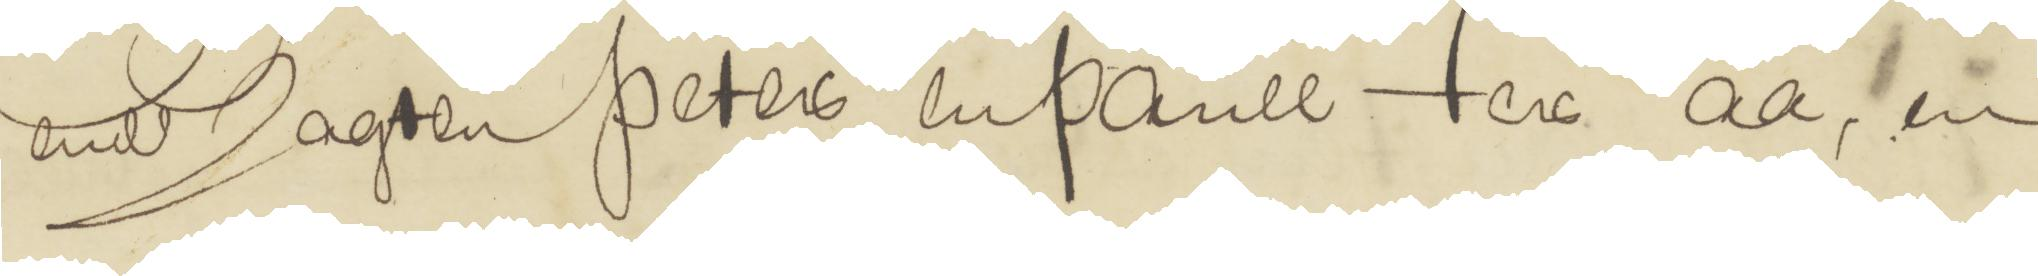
ende Jagten Peter en Paull ter aa, en
